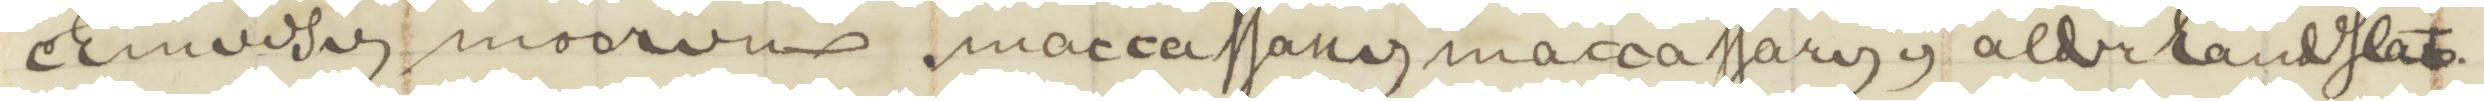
chineesen mooren maccassaren maccassaren en alderhande slav.
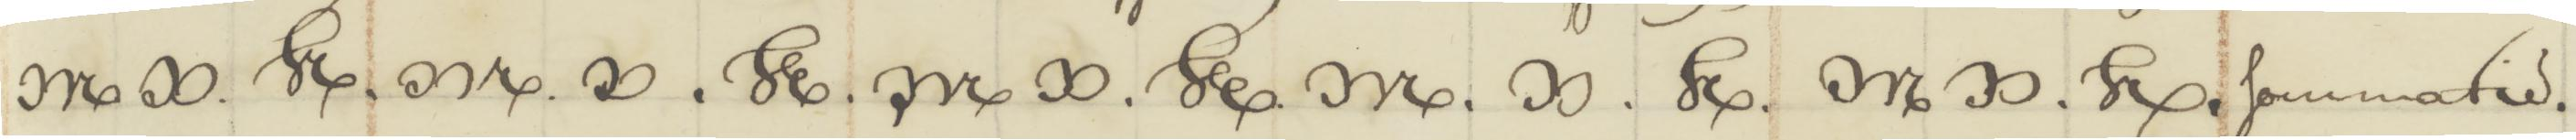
m v. k. m v. k. m v. k. m. v. k. m v. k. sommatie.
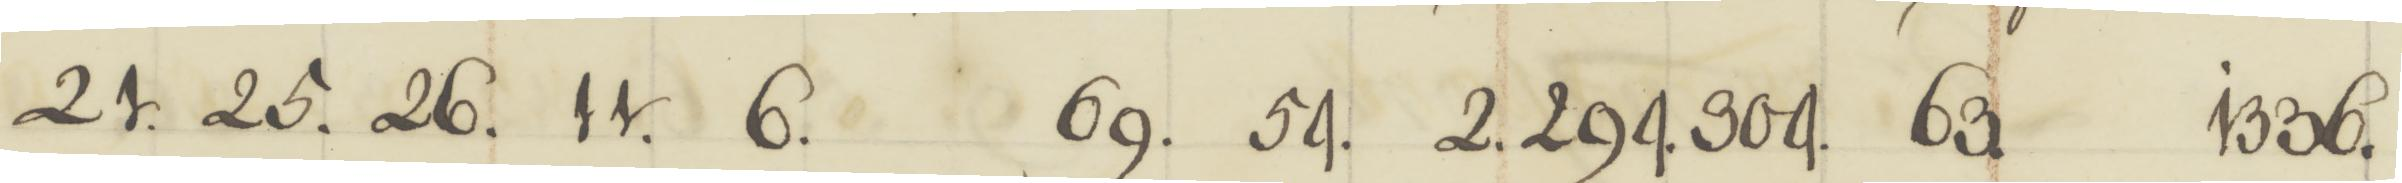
21. 25. 26. 11. 6. 69. 54. 2. 294. 304. 63. 1336.
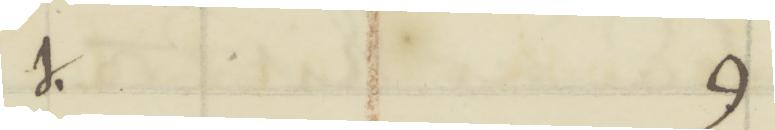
1. 9
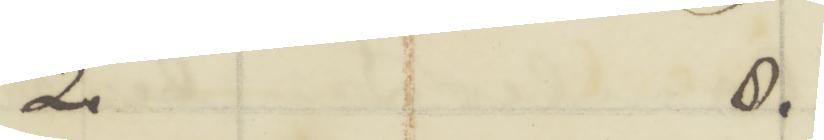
2. 8.
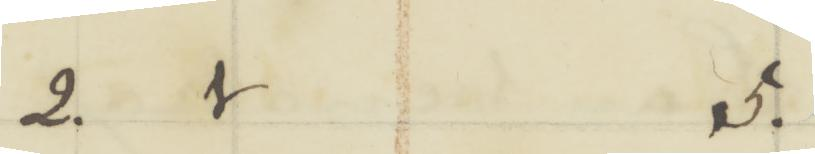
2. 1 5.
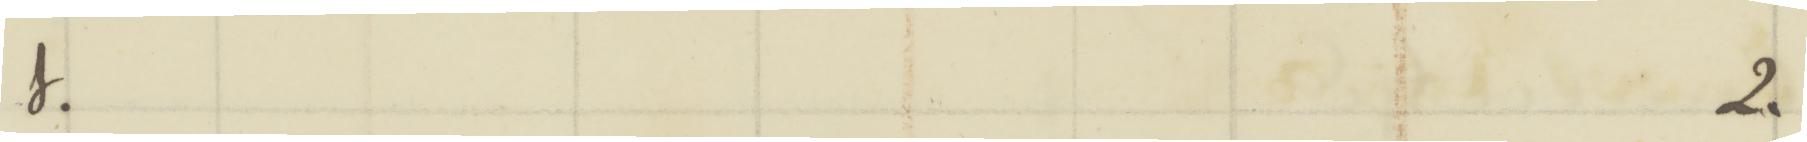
1. 2.
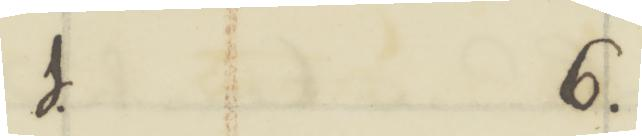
1. 6.
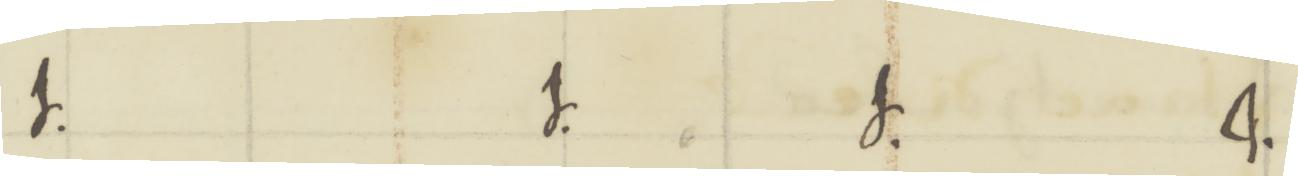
1. 1. 1. 4.
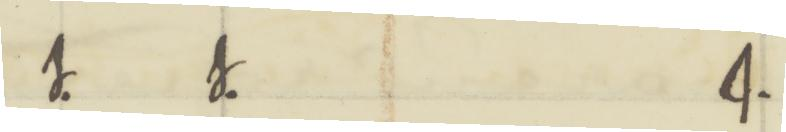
1. 1. 4.
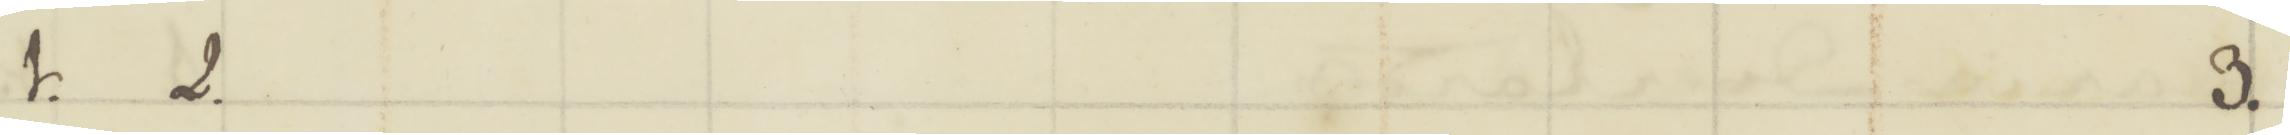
1. 2. 3.
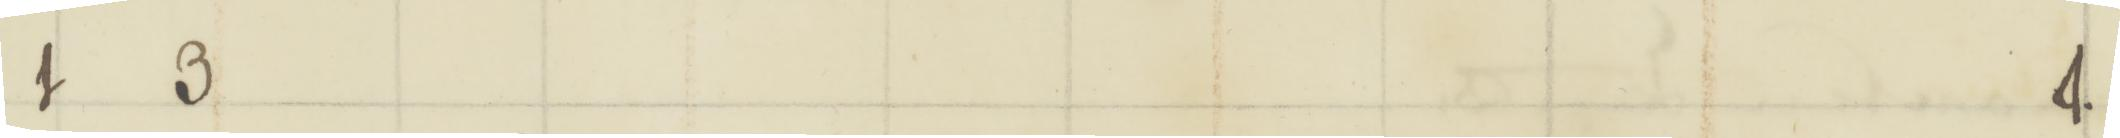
1 3 4.
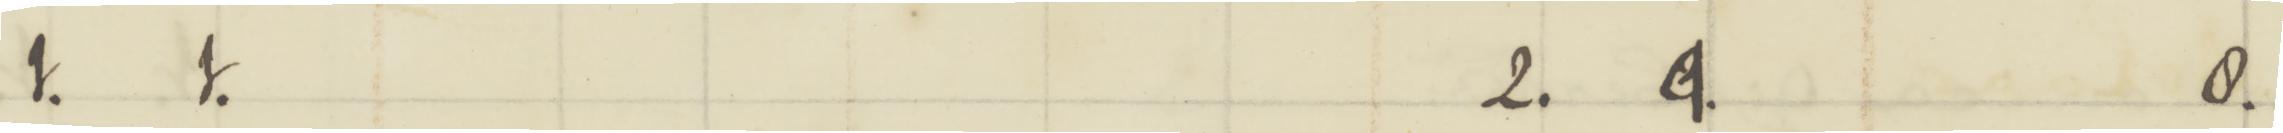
1. 1. 2. 4. 8.
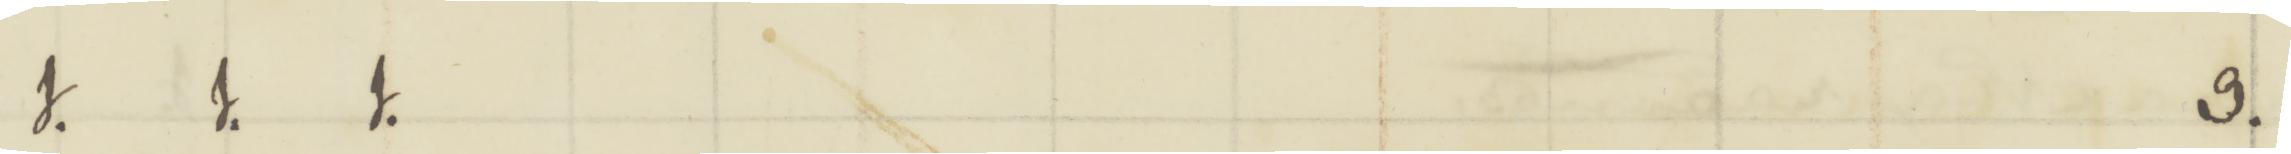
1. 1. 1. 3.
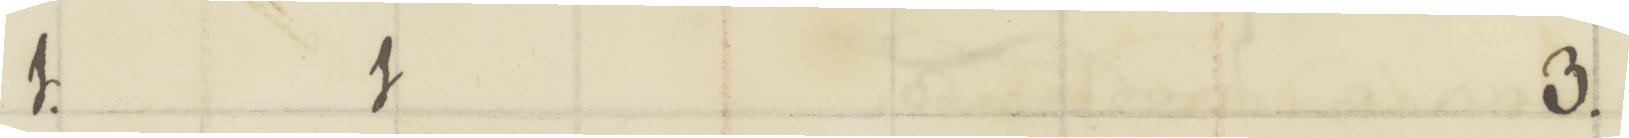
1. 1 3.
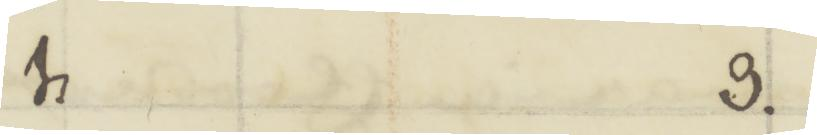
1. 3.
